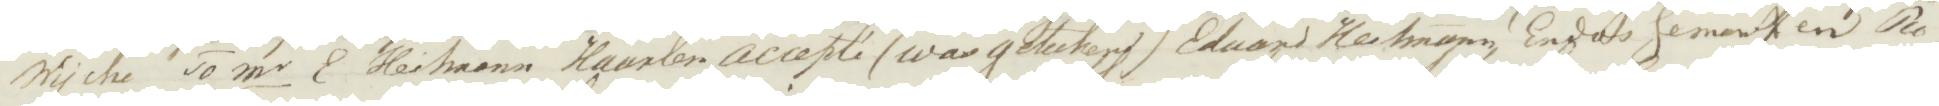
Wijche To mr E Heitmann Haarlem accepti (was geteekend) Eduard Heitmann, Endossementen No
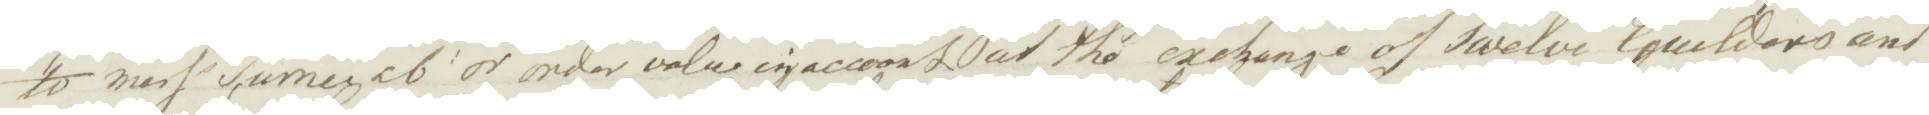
to messs Turner & Cos order value in accoort at the exchange of twelve Guilders and
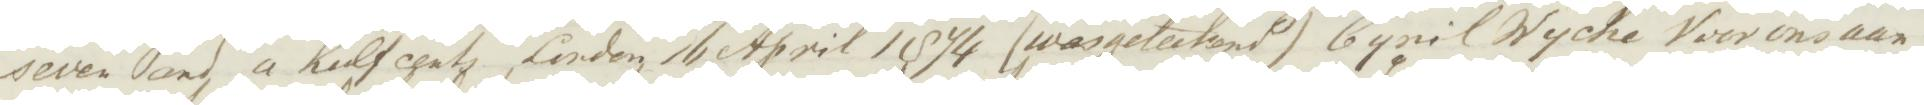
seven and a half cents London 16 April 1874 (was geteekend) Cyril Wyche Voor ons aan
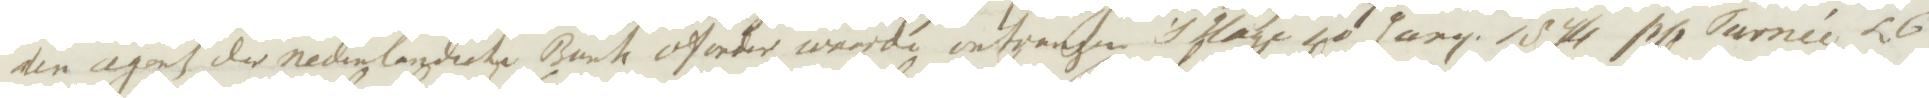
den agent der nederlandsche Bank of order waarde ontvangen 's Hage 10 Juny 1874 pp Turnée & Co
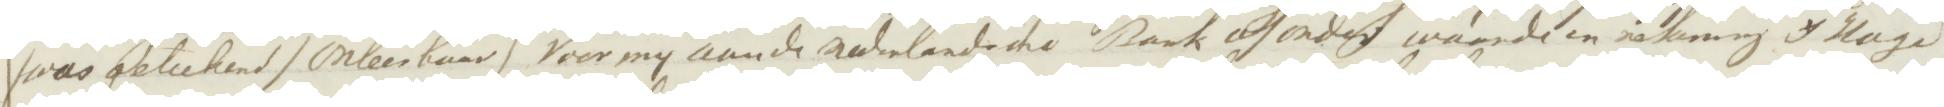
(was geteekend) Onleesbaar) Voor my aan de nederlandsche Bank of order waarde en rekening 's Hage
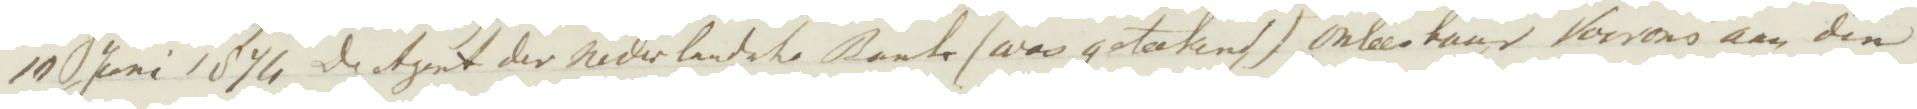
10 Juni 1874 De Agent der Nederlandsche Bank (was geteekend) Onleesbaar Voor ons aan den
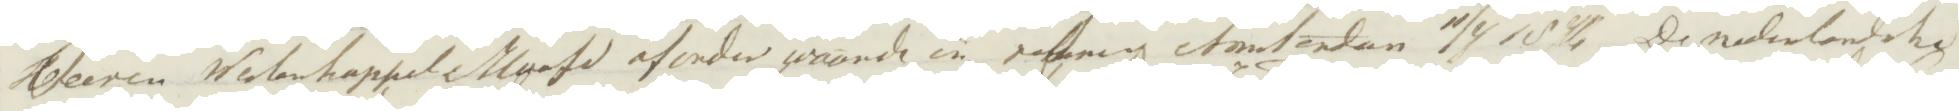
Heeren Westerkappel Hoofd of onder waarde in rekening Amsterdam 11/4 1874 De nederlandsche
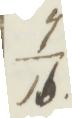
7/16
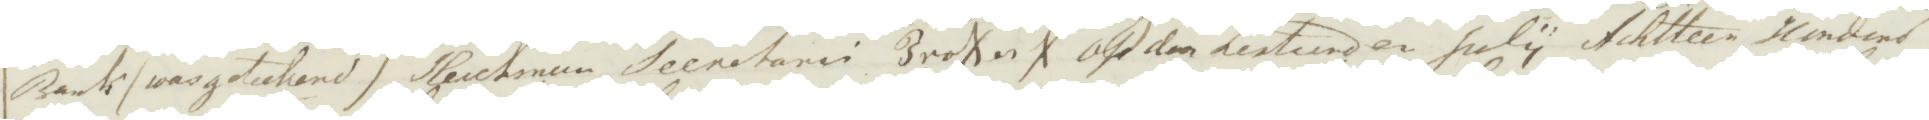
Bank (was geteekend) Heitman Secretaris Protest op den zestienden Julij Achttien Honderd
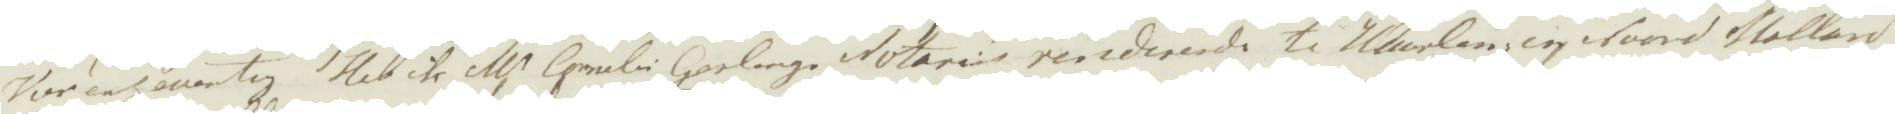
Vier enzeventig Heb ik Mr Cornelis Gerlings Notaris residerende te Haarlem in Noord Holland
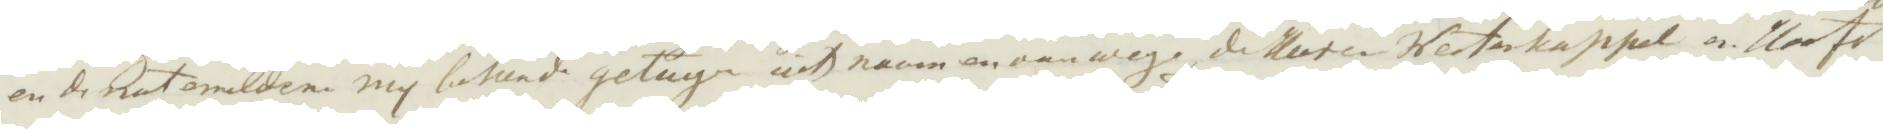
en de natemelde my bekende getuigen uit naam en van wege de Heeren Westerkappel en Hoofd
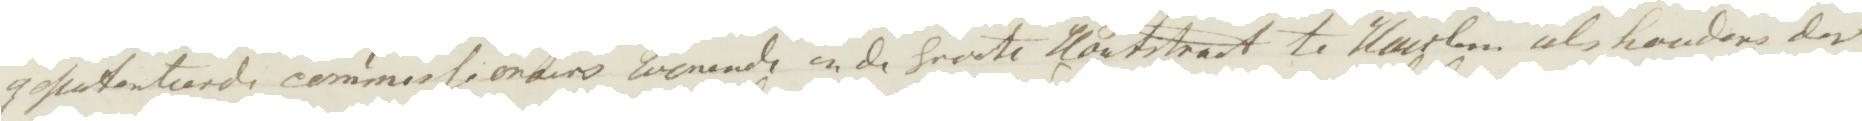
gepatenteerde commissionairs wonende in de Groote Houtstraat te Haarlem als houders der
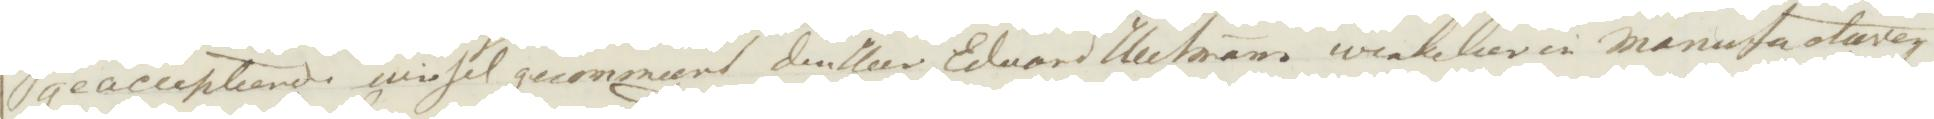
geaccepteerde wissel gesommeerd den Heer Eduard Heitman winkelier in manufacturen
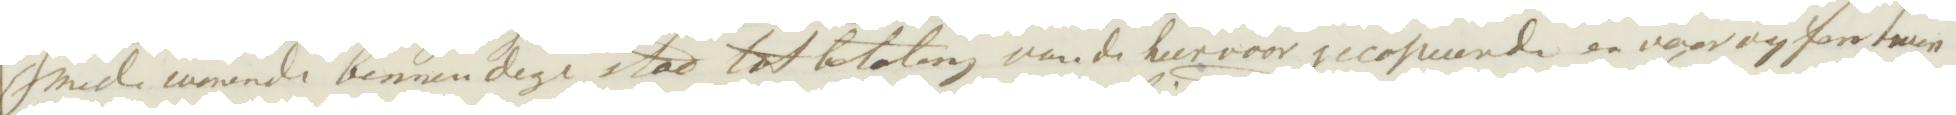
mede wonende binnen deze stad tot betaling van de hiervoor gecopieerde en voor vyfen twin
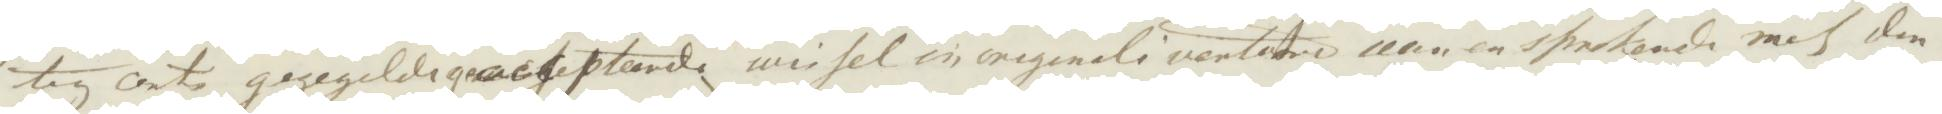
tig cents gezegelde geaccepteerde wissel in originali vertoond aan en sprekende met den
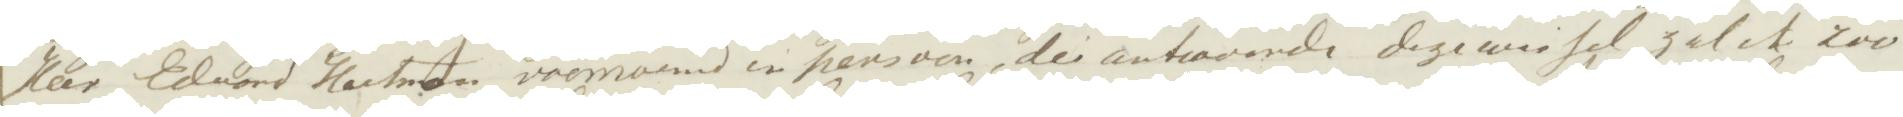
Heer Eduard Heitman voornoemd in persoon, de antwoorde deze wissel zal ik zoo
